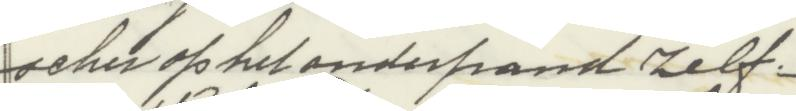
scher op het onderpand zelf:
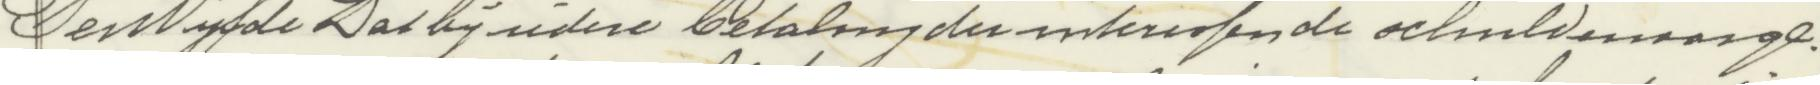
Ten Vijfde Dat bij iedere betaling der interessen de schuldenaar ge.
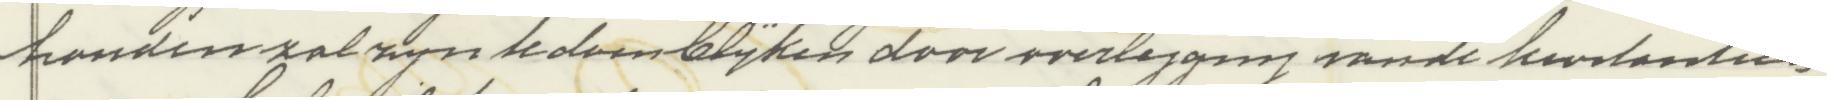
houden zal zyn te doen blijken door overlegging van de kwitanties
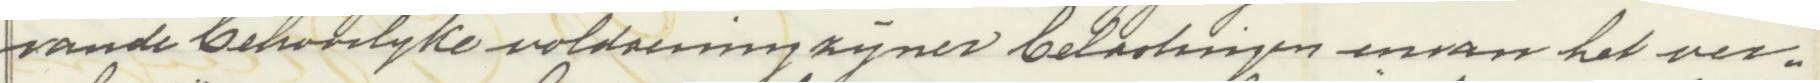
van de behoorlyke voldoening zijner belastingen en van het ver„
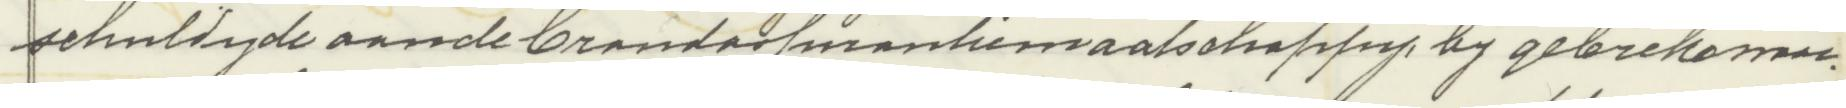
schuldigde aan de brandassurantiemaatschappy bij gebreke waar.
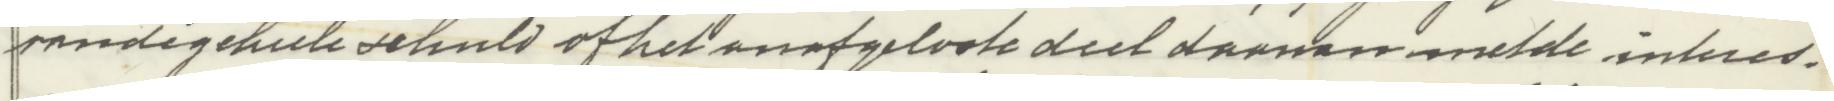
van de geheele schuld of het onafgeloste deel daarvan met de interes„
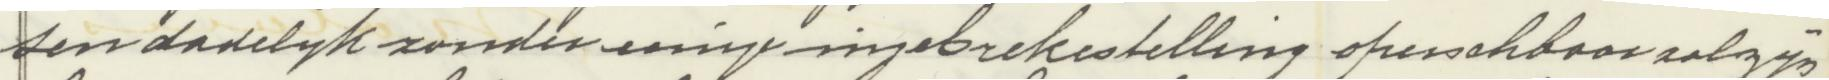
sen dadelijk zonder eenige ingebrekestelling opeischbaar zal zijn
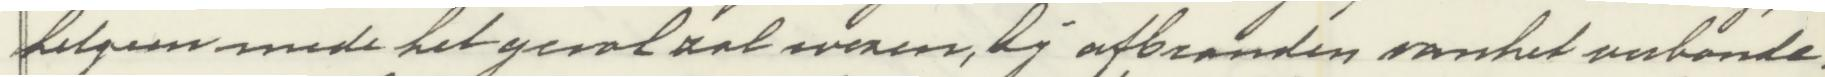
hetgeen mede het geval zal wezen, bij afbranden van het verbonde
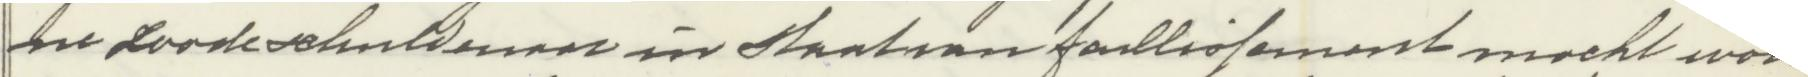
ne zoo de schuldenaar in staat van fallissement mocht wor
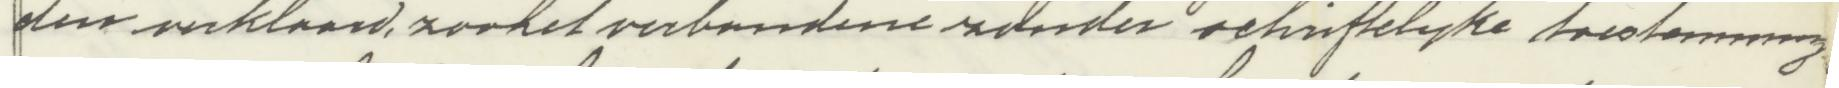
den verklaard, zoo het verbondene zonder schriftelijke toestemming
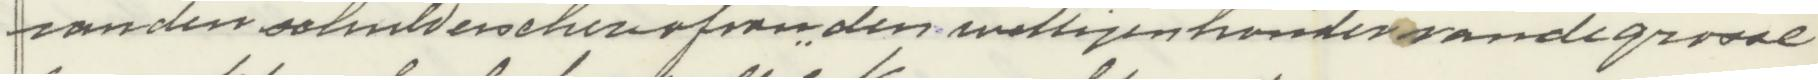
van den schuldeischer of van den wettigen houder van de grosse
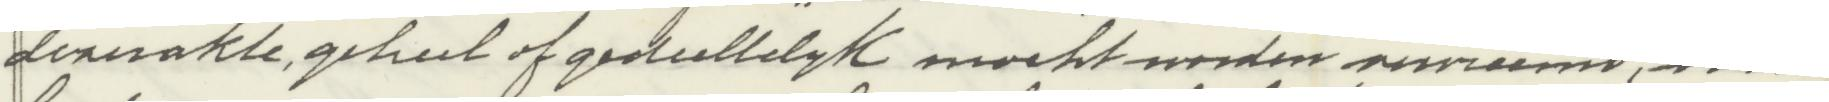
dezer akte, geheel of gedeeltelyk mocht worden vervreemd, van
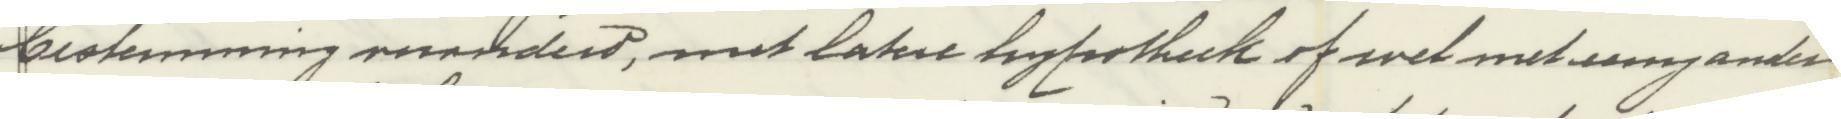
bestemming veranderd, met latere hypotheek of wel met eenig ander
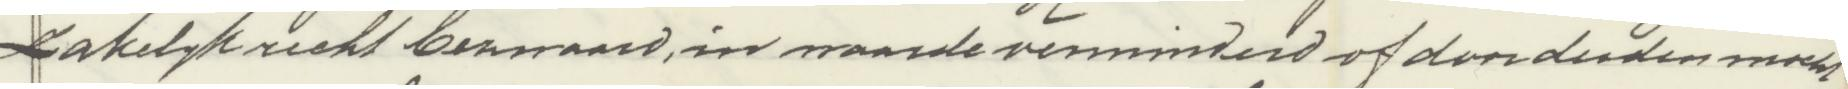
zakelyk recht bezwaard, in waarde verminderd of door derden mocht
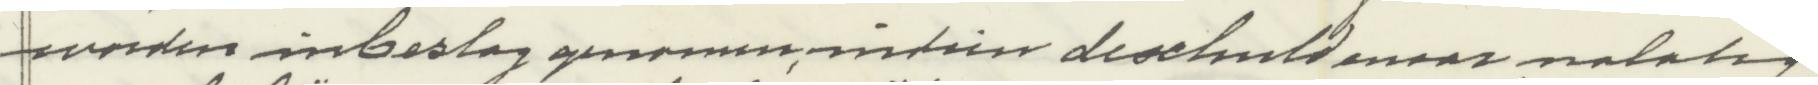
worden inbeslag genomen, indien de schuldenaar nalatig
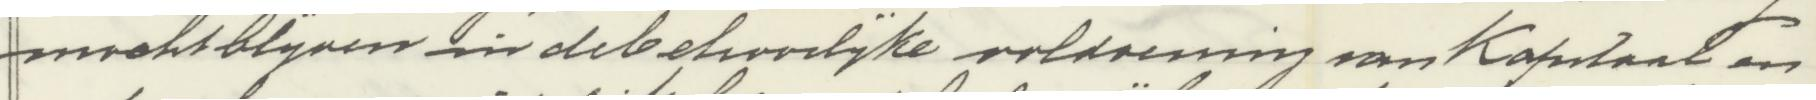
mocht bijven in de behoorlijke voldoening van Kapitaal en
